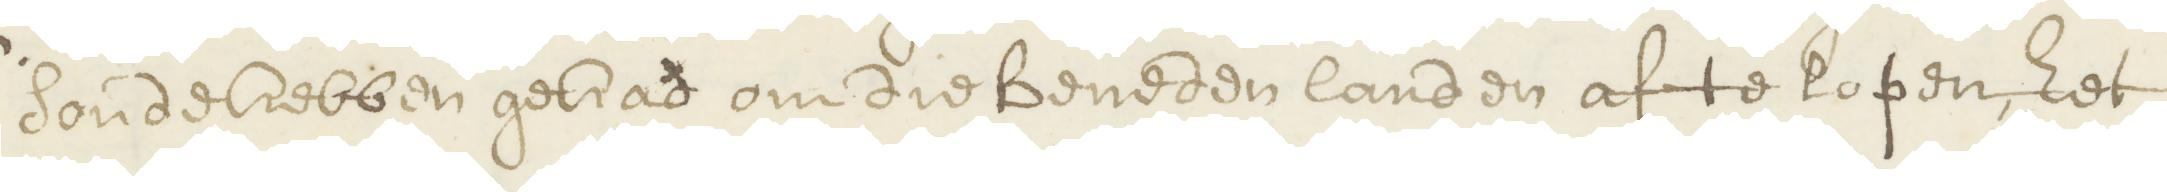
soude hebben gehad om die beneden landen af te lopen, het
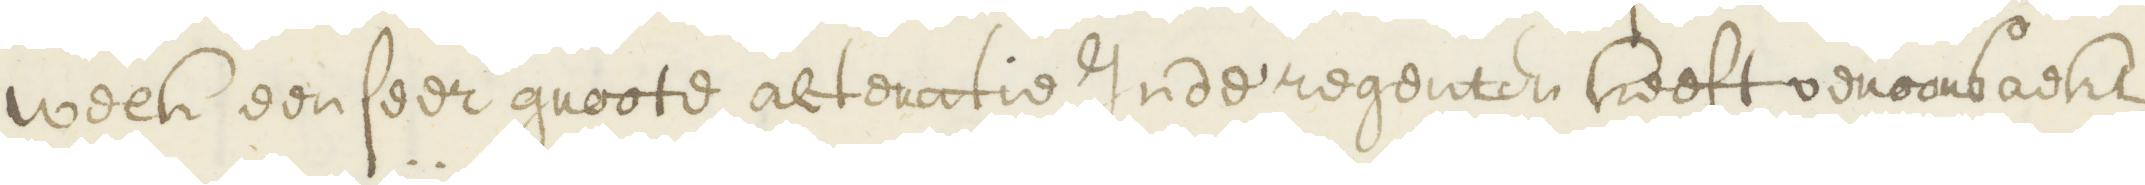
welk een seer groote alteratie Jnde regenten heeft veroorsaekt
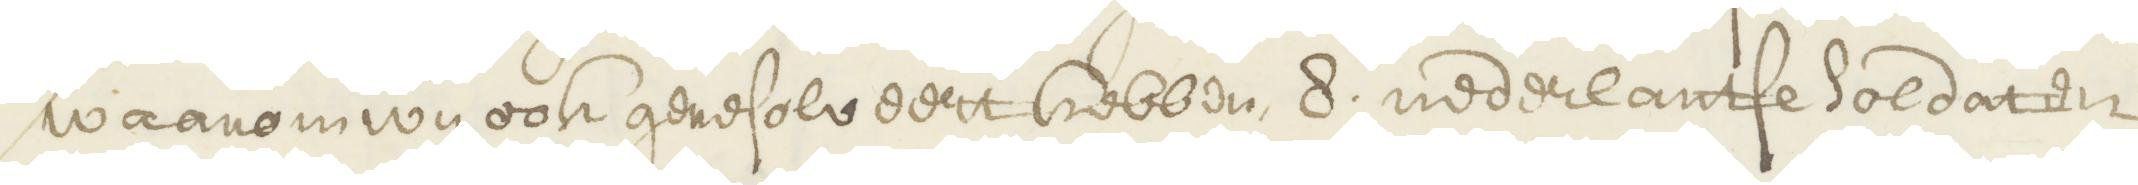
waarom wij ook geresolveert hebben, 8. nederlantse soldaten,
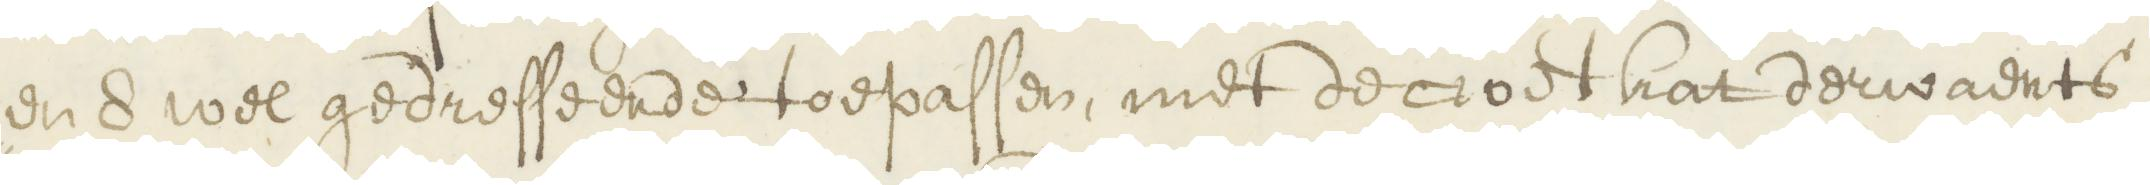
en 8 wel gedresseerde toepassen, met de civetkat derwaerts
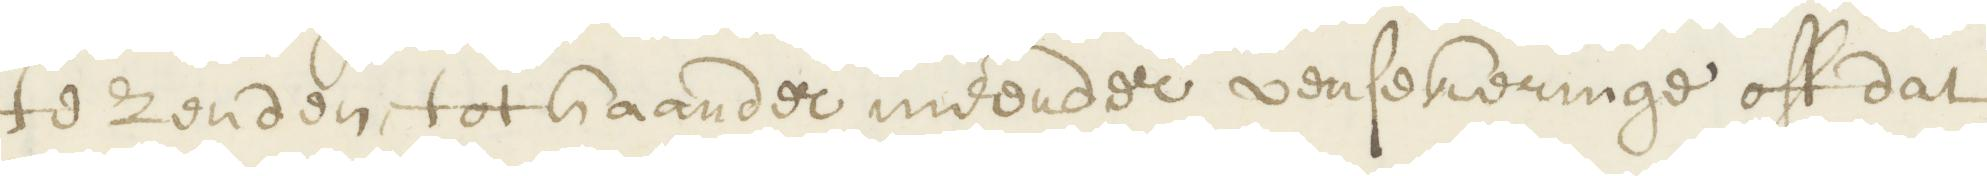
te zenden, tot haarder meerder versekeringe oft dat
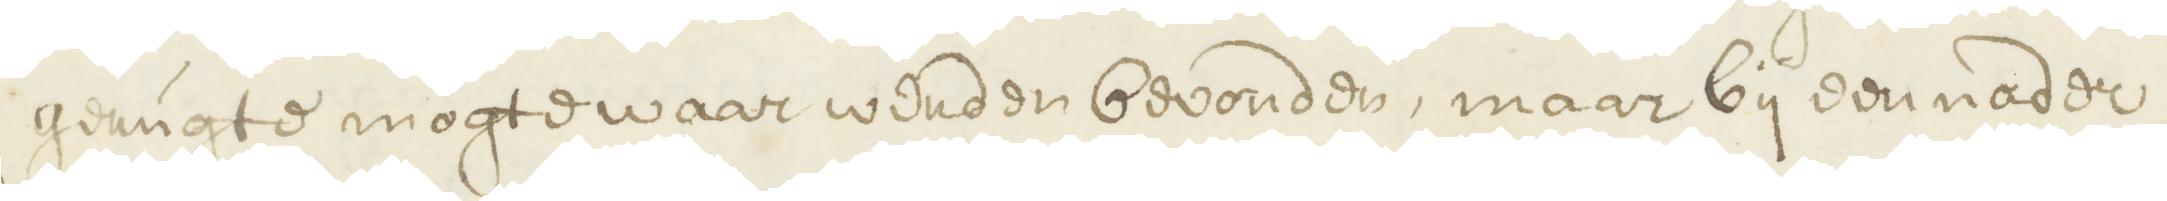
gerugte mogte waar werden bevonden, maar bij een nader
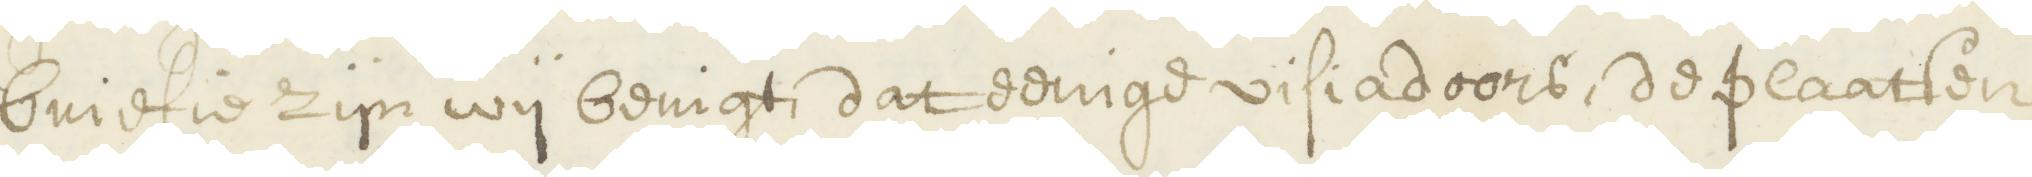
briefie zijn wij berigt, dat eenige visiadoors, de plaatsen
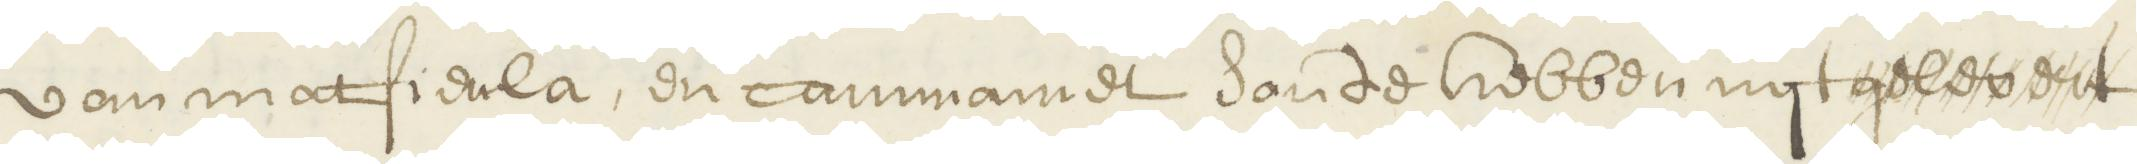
van matsierla, en cammamet soude hebben uijt gelevert
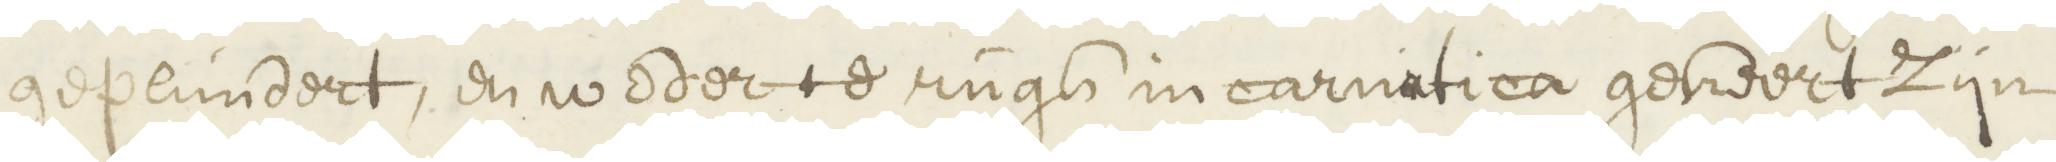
geplundert, en weder te rugh in carnatica gekeert zijn
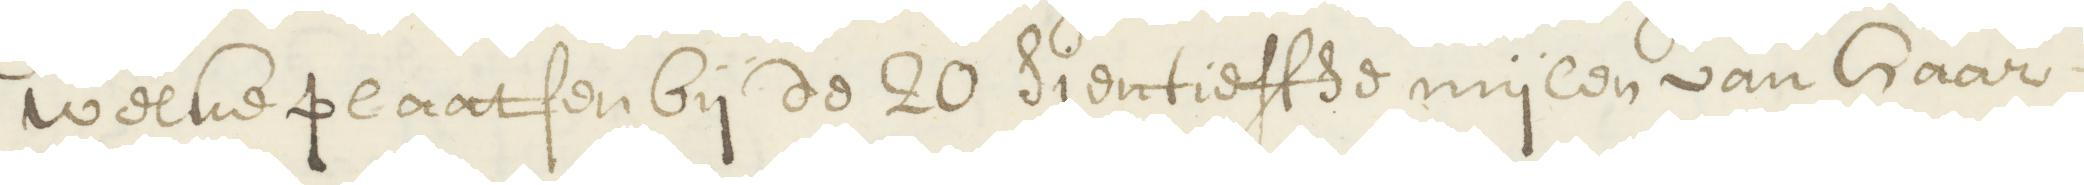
welke plaatsen bij de 20 sjentieffse mijlen van haar
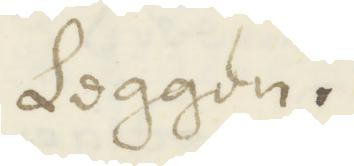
leggen.
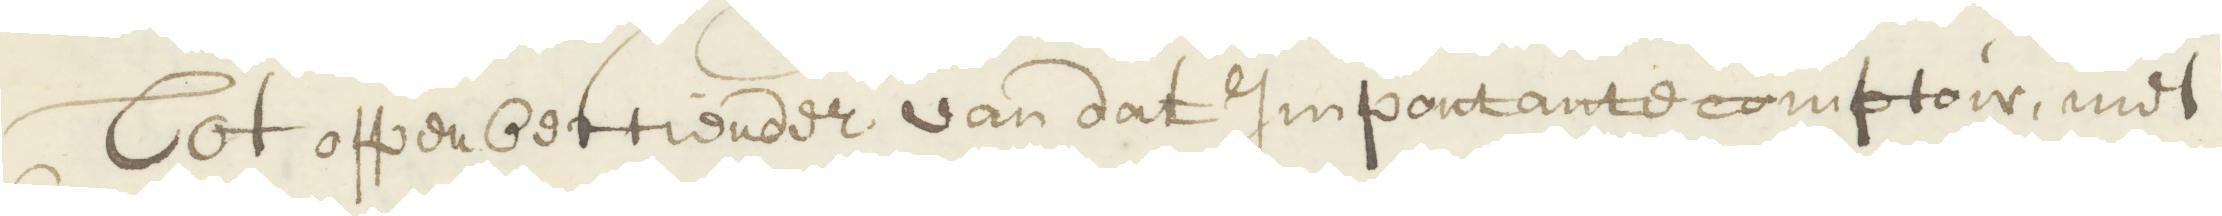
Tot opperbestierder van dat Jmportante comptoir, met
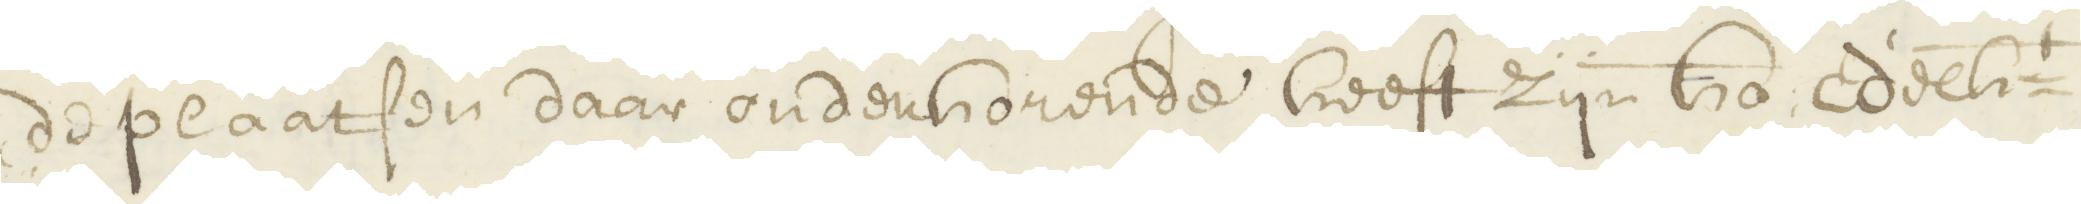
de plaatsen daar onderhorende heeft zijn ho: Edelh=t
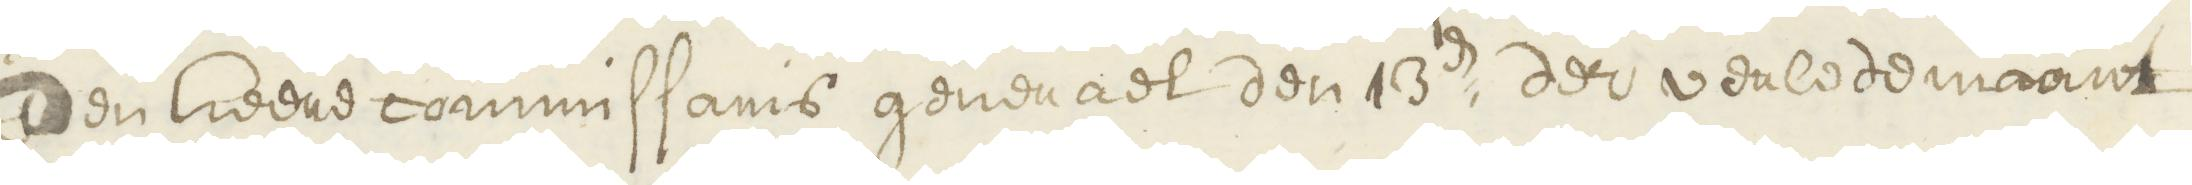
den heere commissaris generael den 13„' der verlede maant
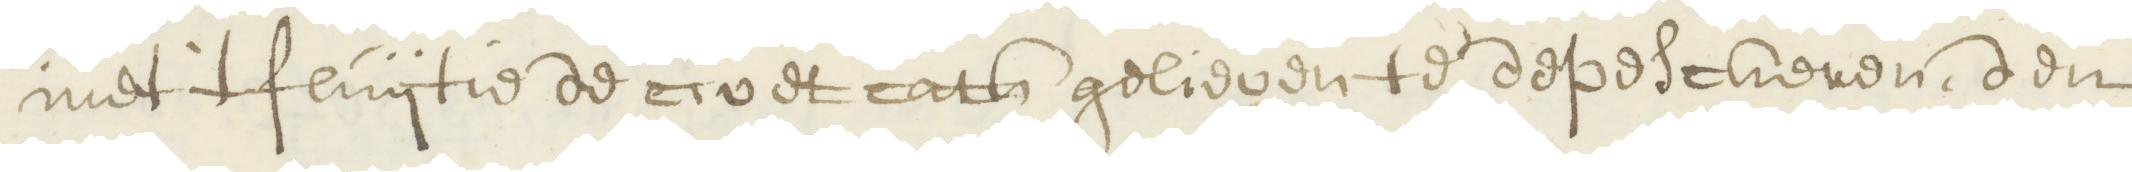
met ’t fluijtie de civet cath gelieven te depescheren, den
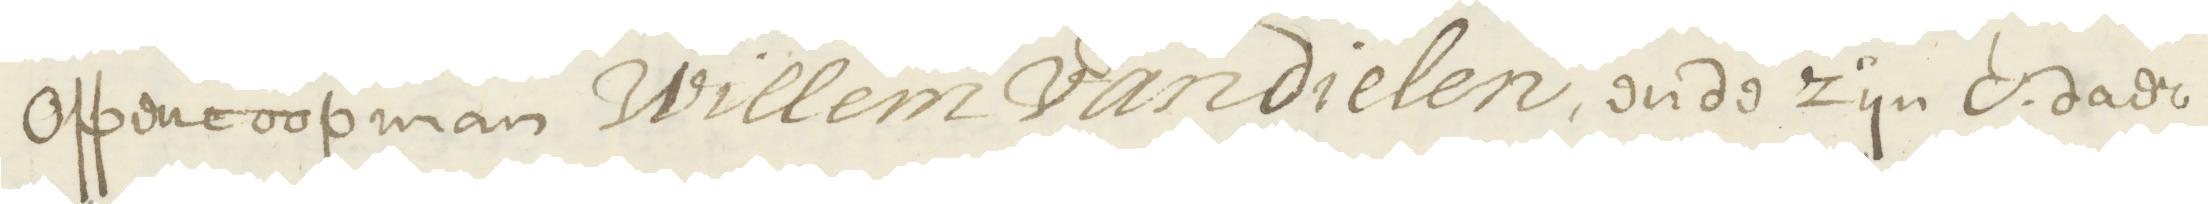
Oppercoopman Willem van dielen, ende zijn E. daer
